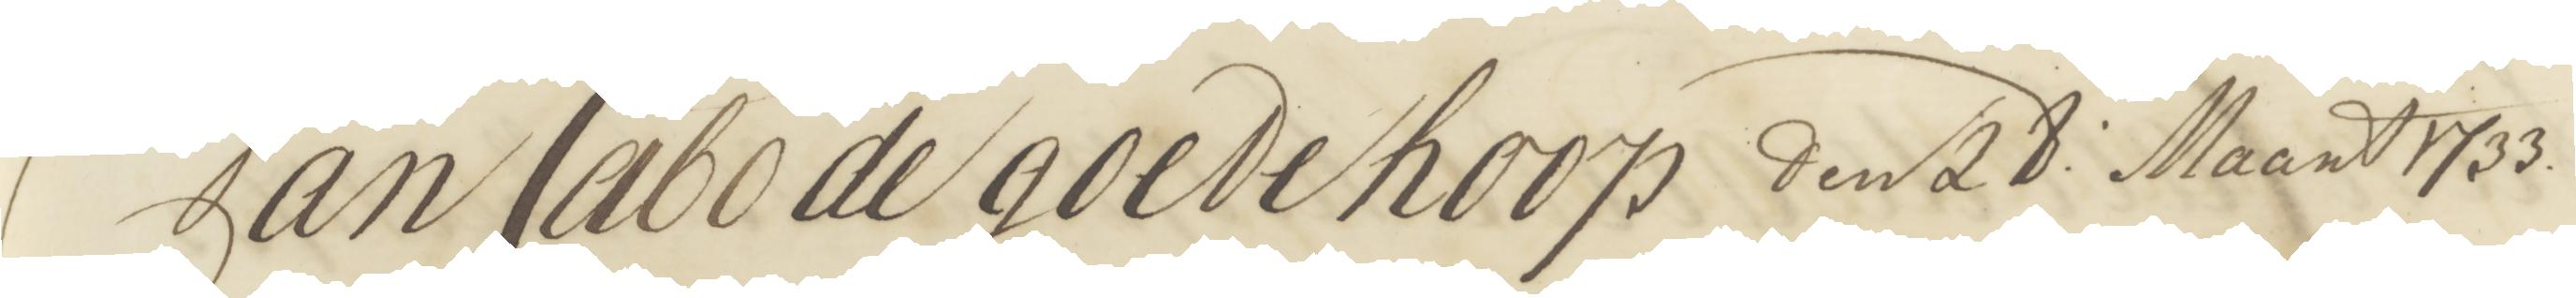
Van Cabo de goede hoop den 28:' Maart 1733.
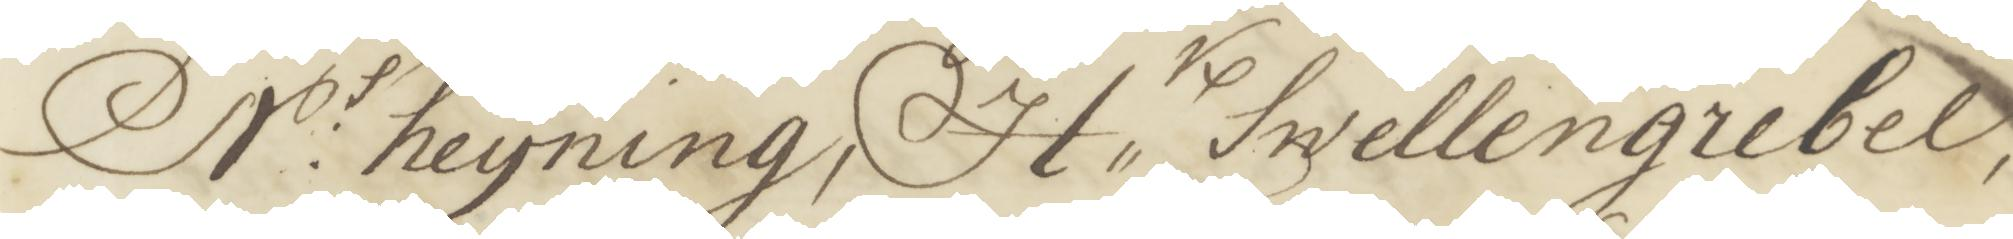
N:s heijning, H„k Swellengrebel
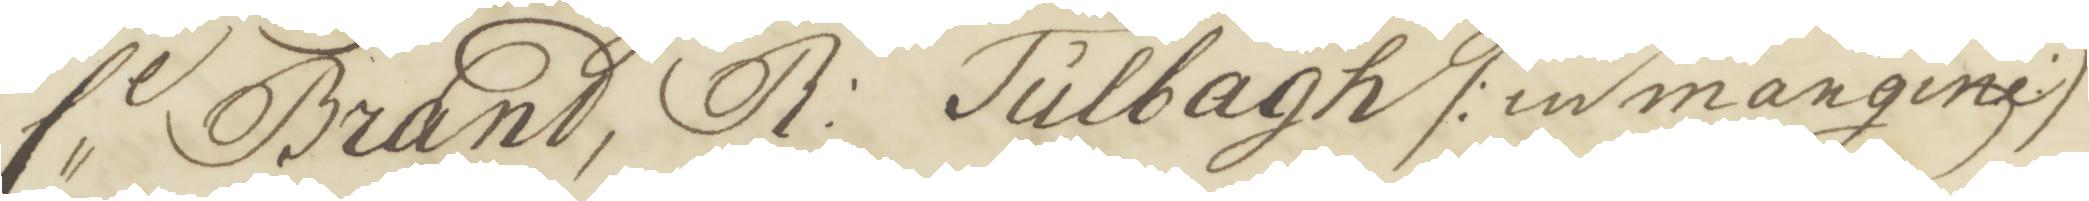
C„l Brand, R: Tulbagh (:in margine:)
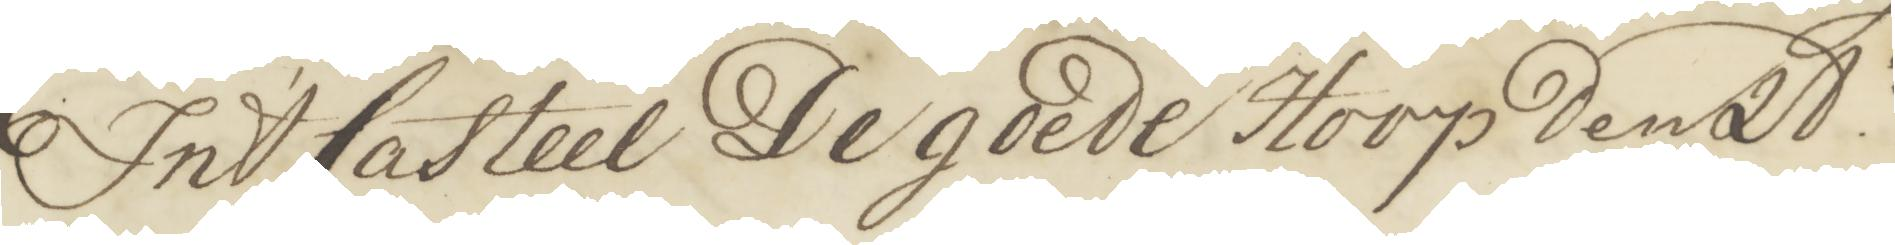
In't Casteel De goede Hoop den 28:e
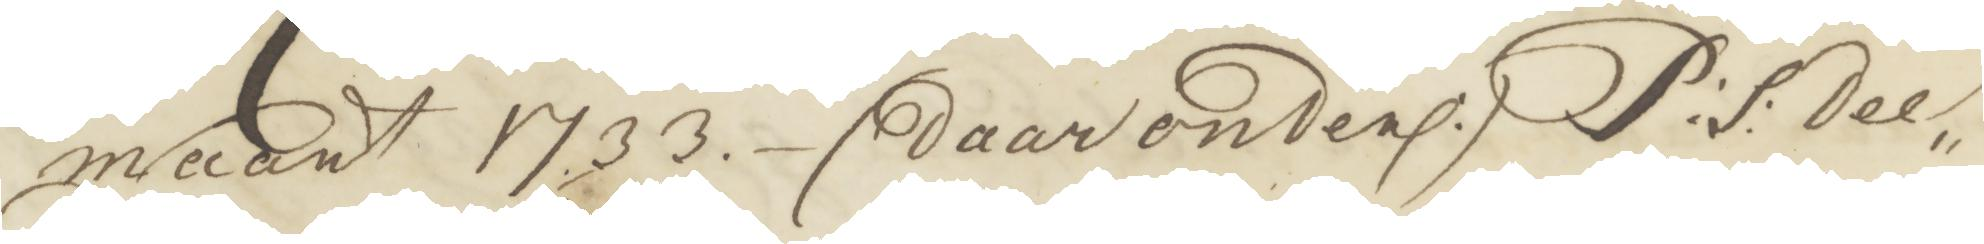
maart 1733. — (daar onder:) P:S: dee„
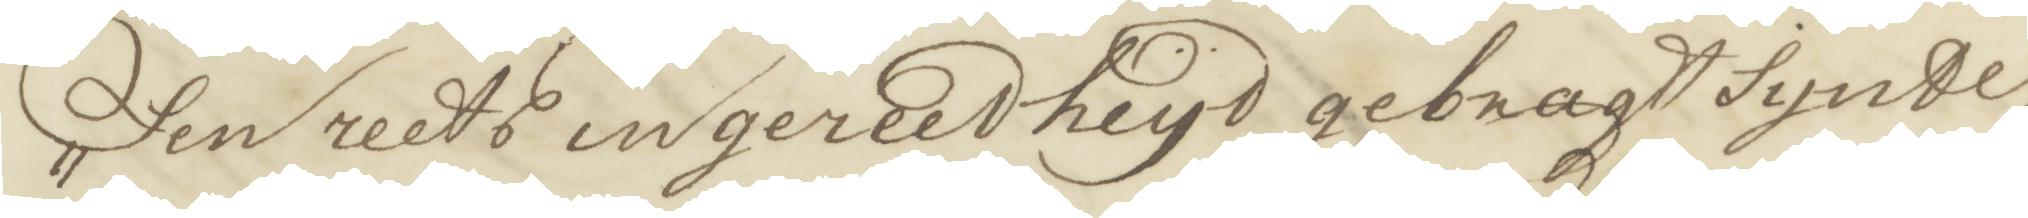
„sen reets in gereedheijd gebragt sijnde,
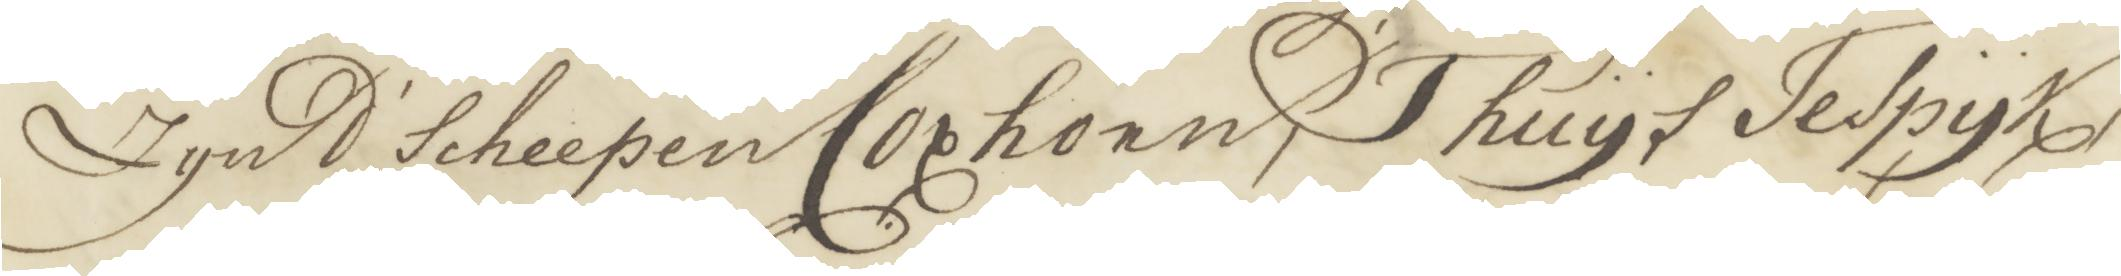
zijn d’ scheepen Coxhorn, 'Thuijs Tespijk,
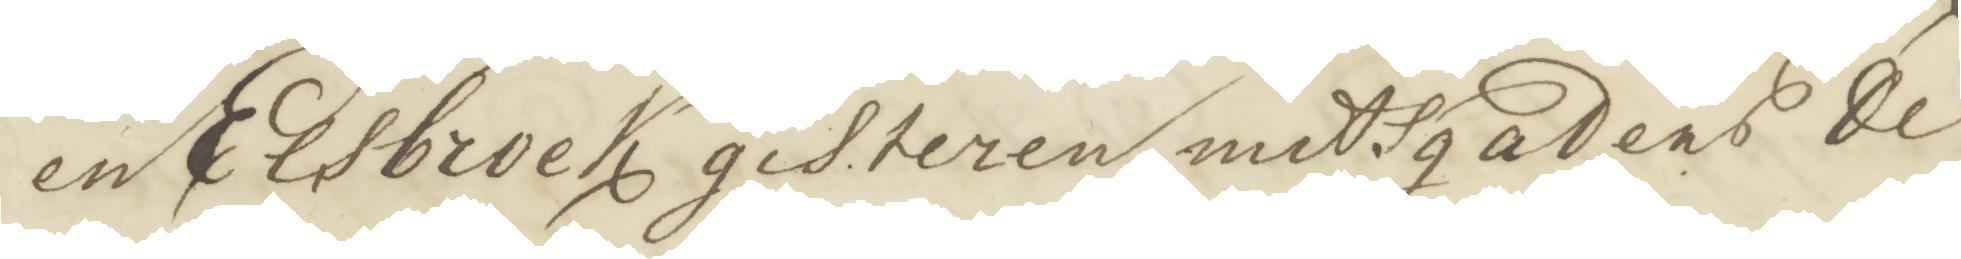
en Elsbroek gisteren, mitsgaders de
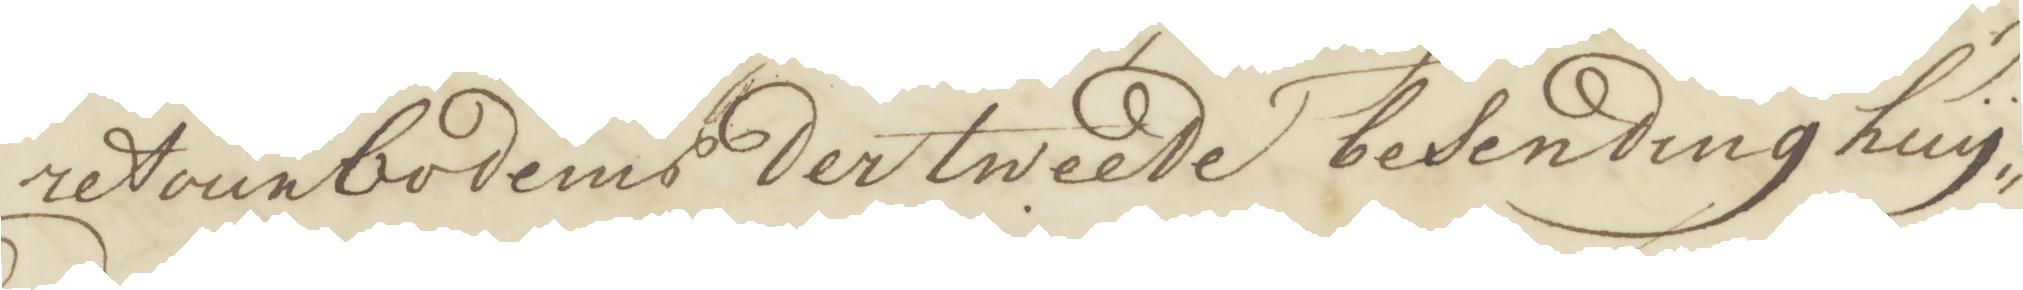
retourbodems der tweede besending huij„
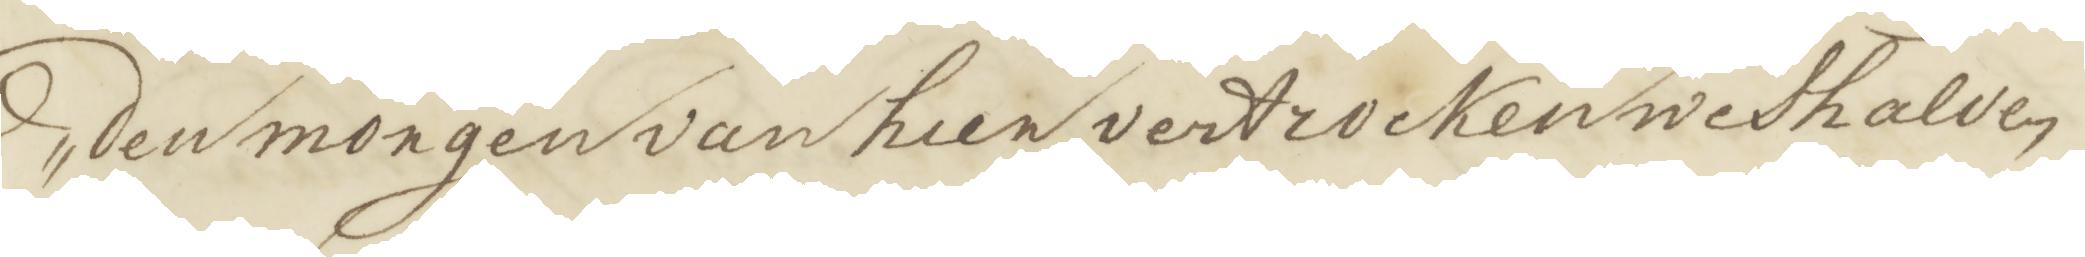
„den morgen van hier vertrocken weshalven
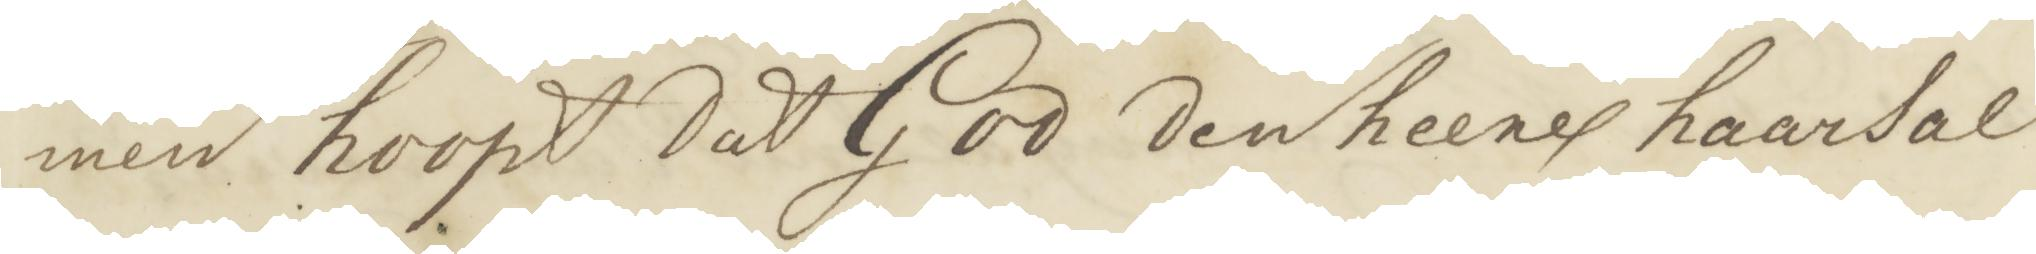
men hoopt dat God den heere haare sal
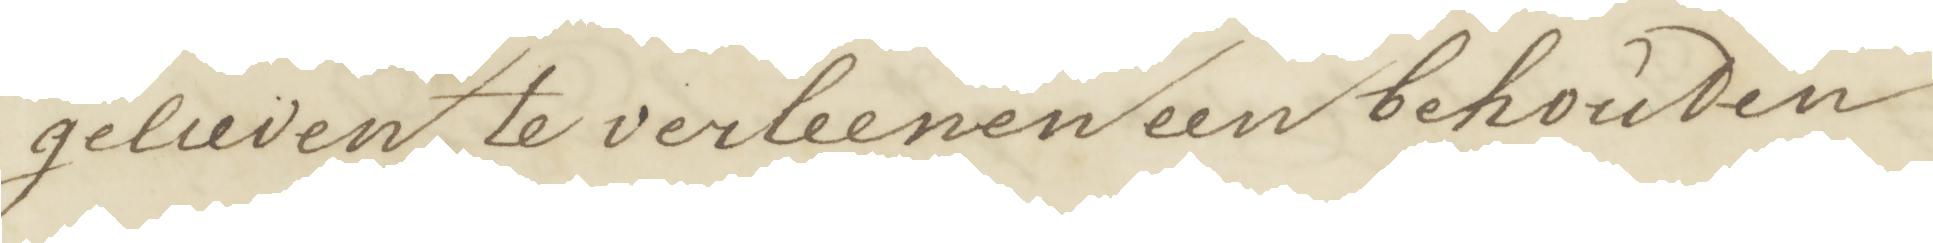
gelieven te verleenen een behouden
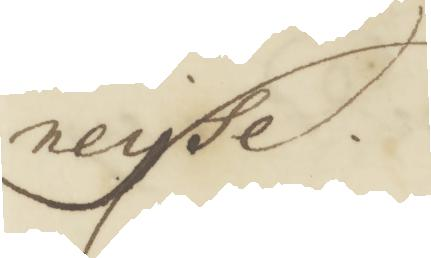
reijse.
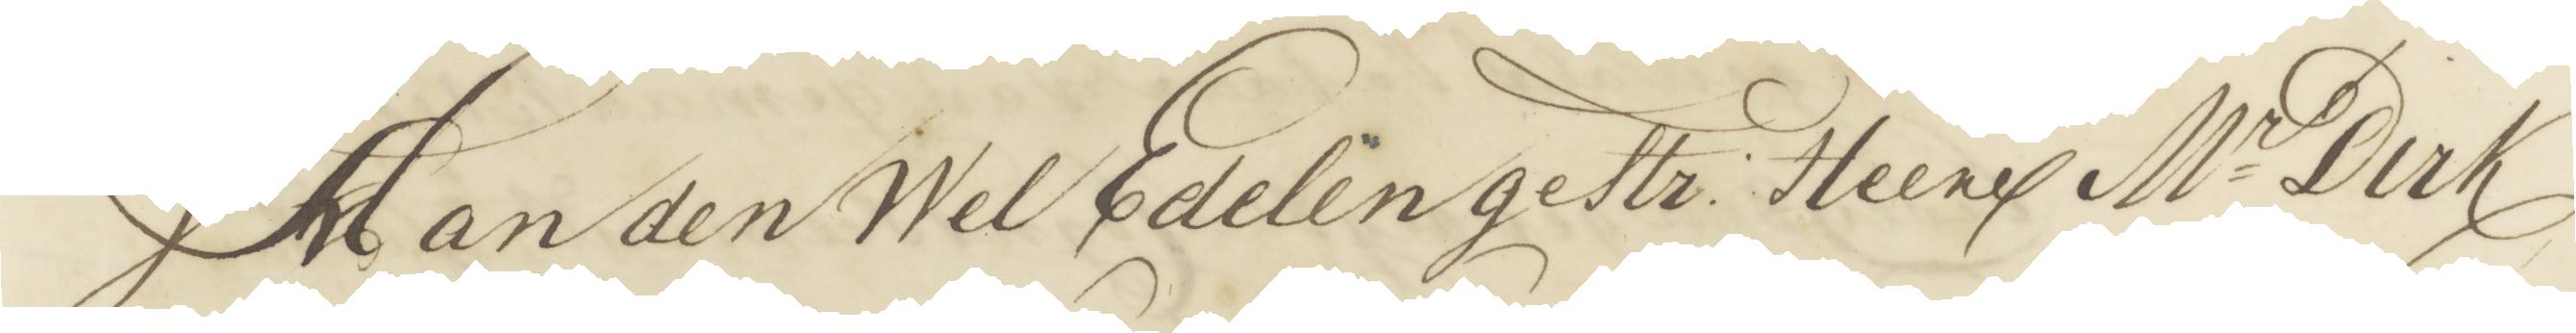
Aan den Wel Edelen gestr: Heere M=r Dirk
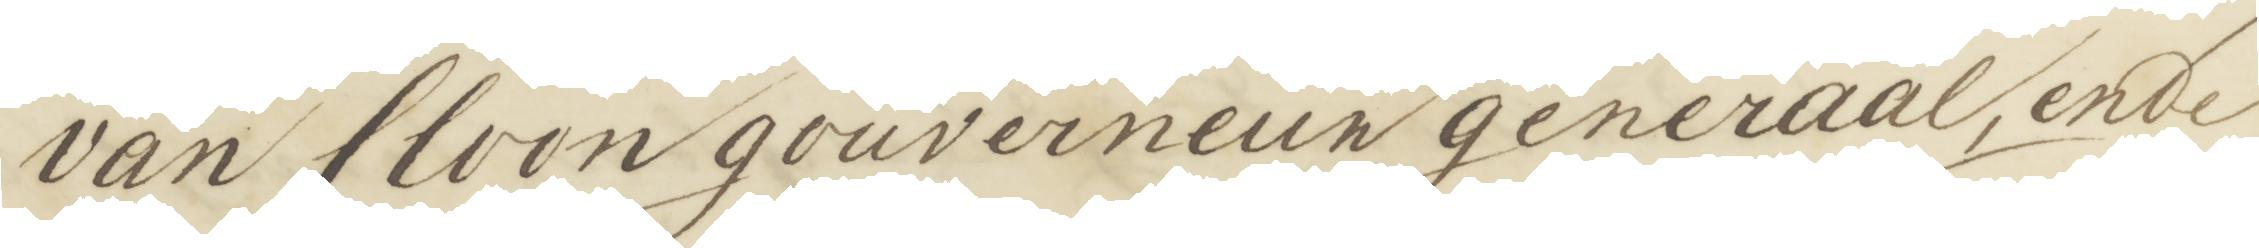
van Cloon gouverneur generaal, ende
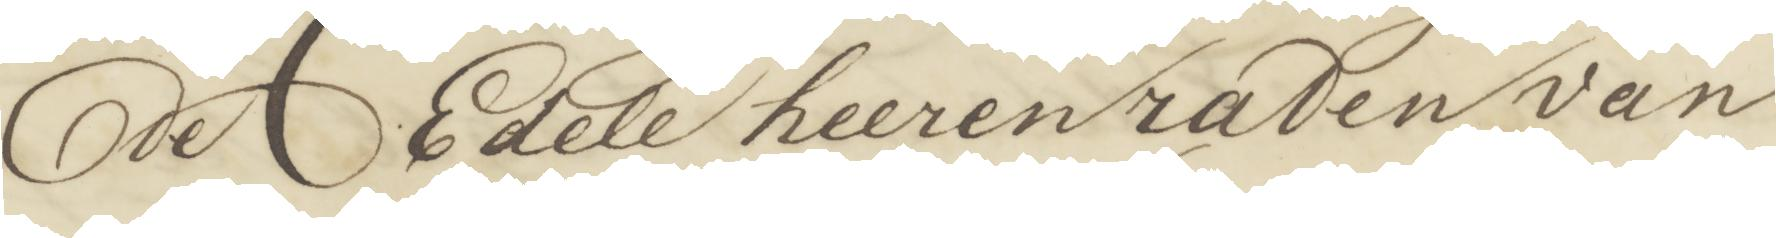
de Edele heeren raden van
